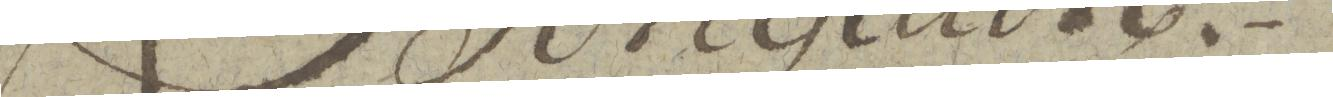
Bengalen.-
